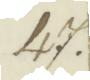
47.
